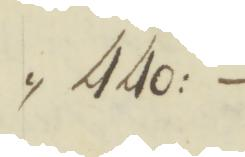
„ 440: —
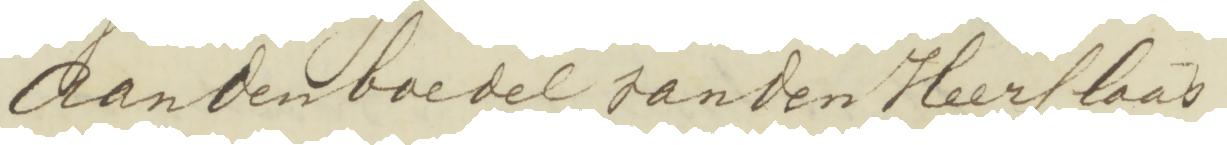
Aan den boedel van den Heer Claas
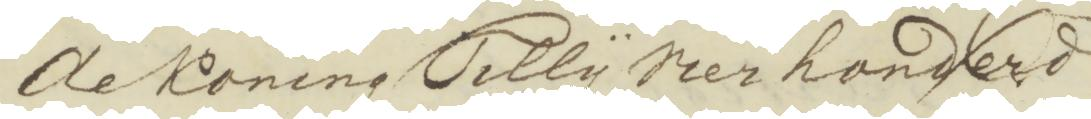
de Koning Tillij vier honderd
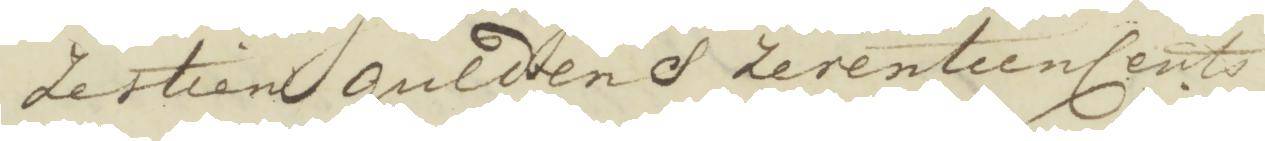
Zestien guldens zeventien Cents
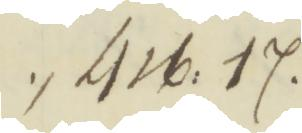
„416:17.
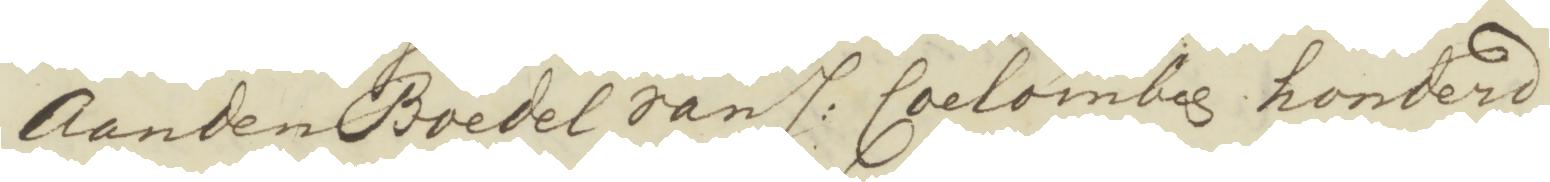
Aan den Boedel van J: Coelombie honderd
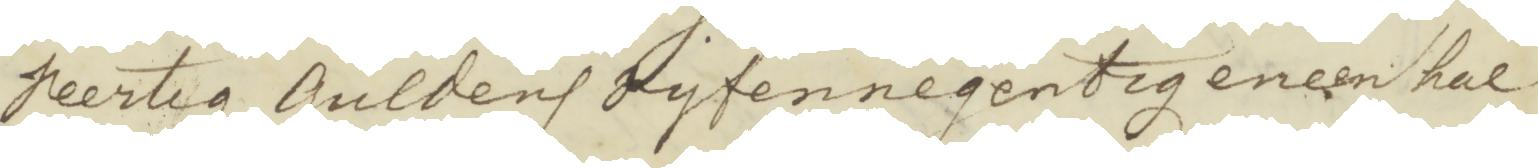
veertig Guldens vyfennegentig en een hal
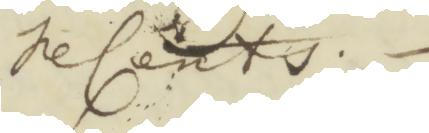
ve Cents.—
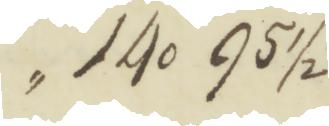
„ 140 95½
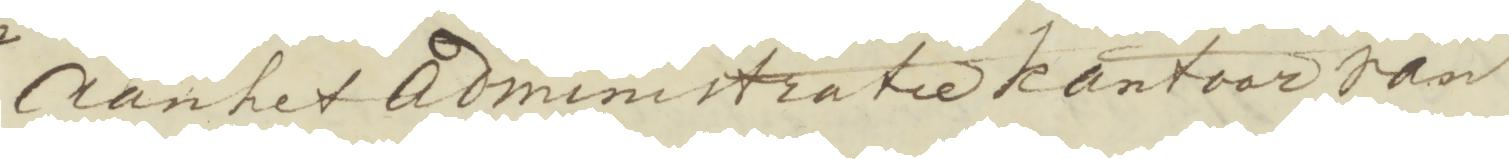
Aan het Administratie kantoor van
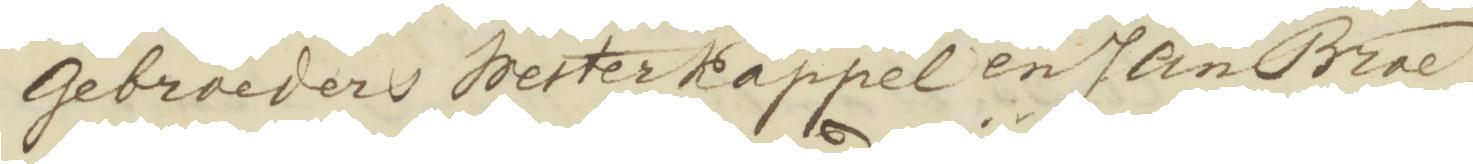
gebroeders Westerkappel en Jan Broe
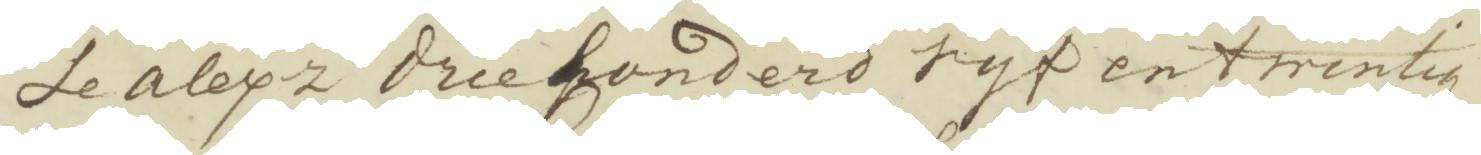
se alexz drie honderd vijf en twintig
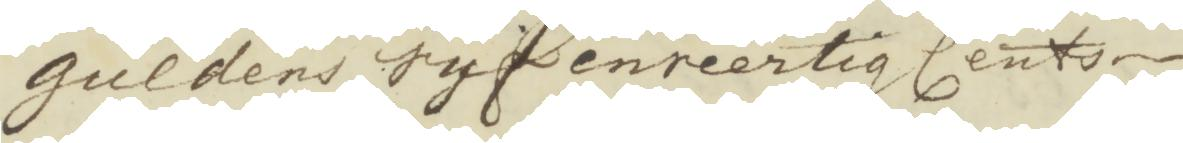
guldens vijfenveertig Cents —
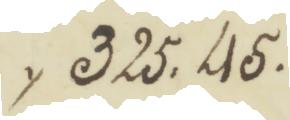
„ 325:45.
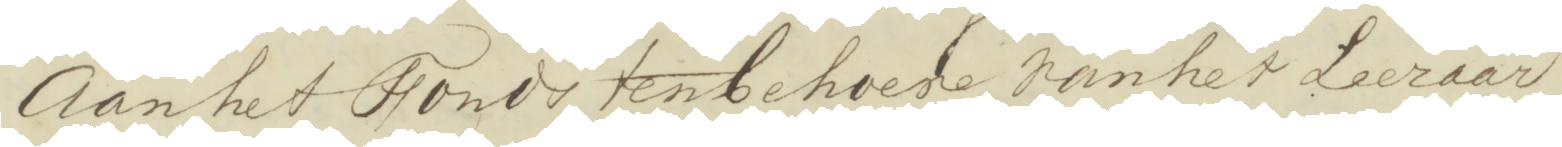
Aan het Fonds ten behoeve van het Leeraar
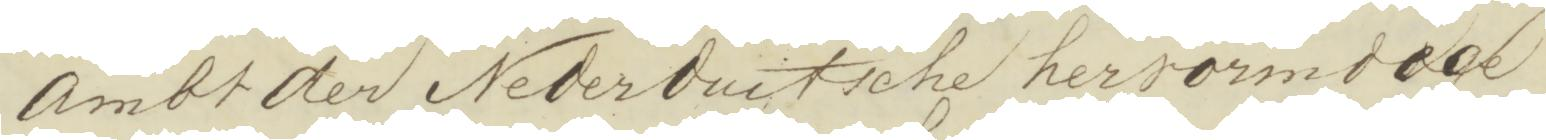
Ambt der Nederduitsche hervormde ge
